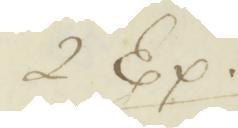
2 Ex
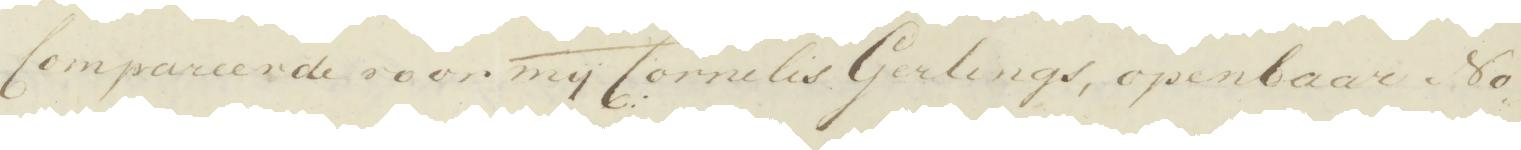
Compareerde voor mij Cornelis Gerlings, openbaar No„
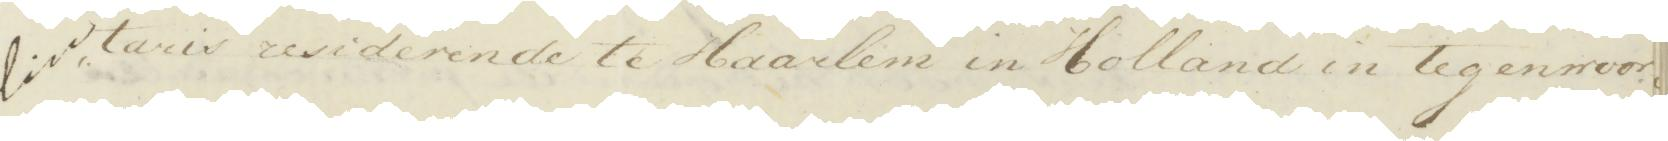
taris residerende te Haarlem in Holland, in tegenwoord
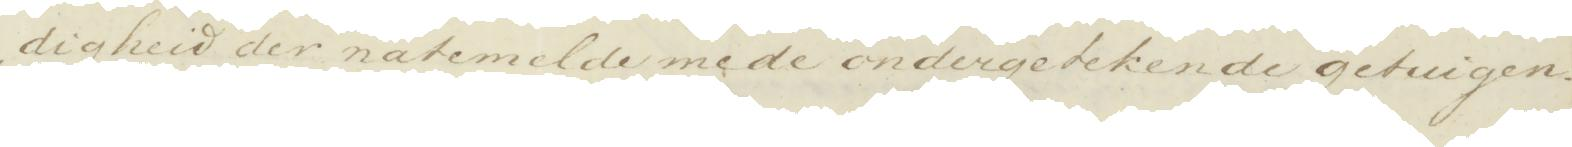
digheid der natemelde mede ondergetekende getuigen
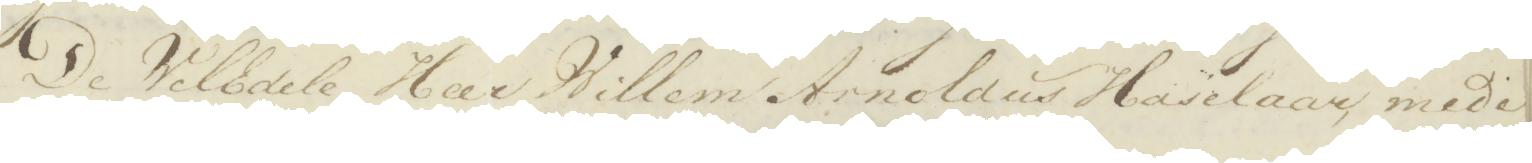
De WelEdele Heer Willem Arnoldus Haselaar, mede
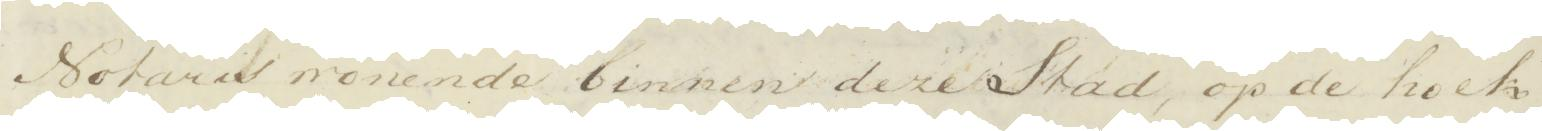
Notaris wonende, binnen deze Stad, op de hoek
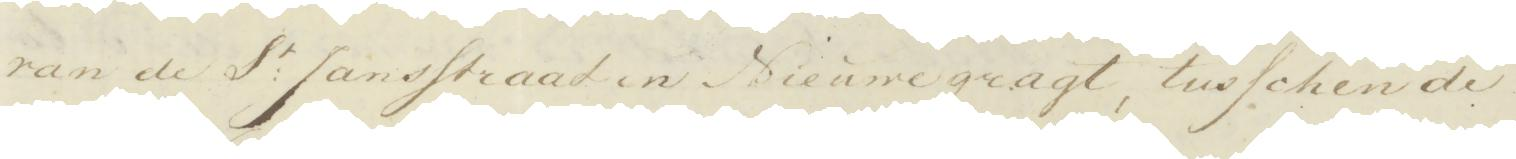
van de S:t Jansstraat en Nieuwe gragt, tusschen de
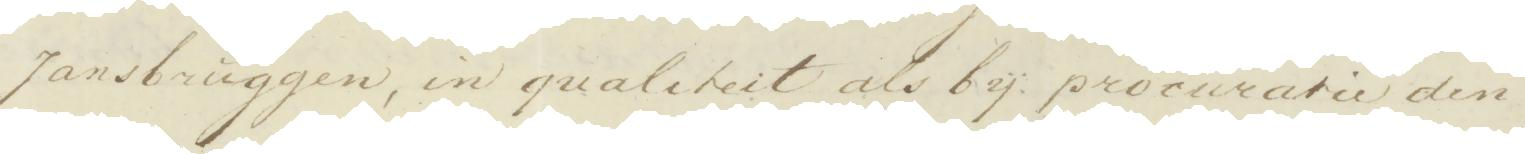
Jansbruggen, in qualiteit als bij procuratie den
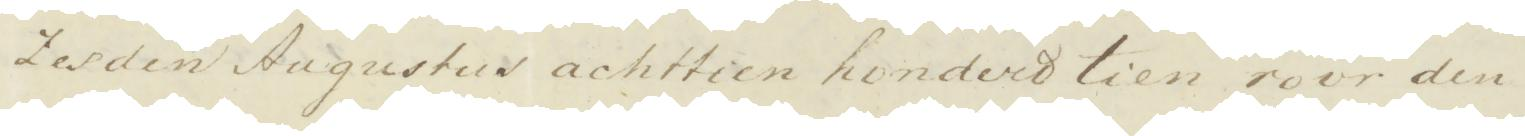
Zesden Augustus achttien honderd tien voor den
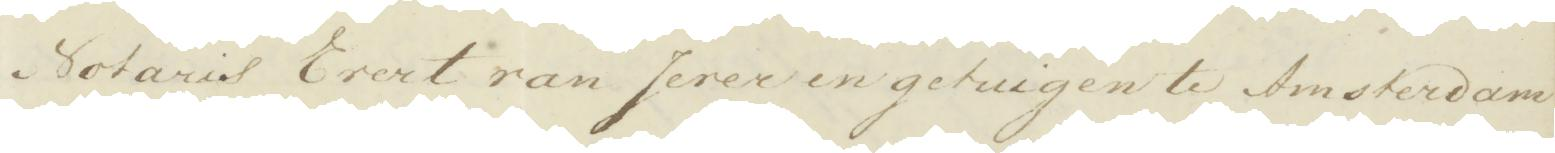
Notaris Evert van Jever en getuigen te Amsterdam
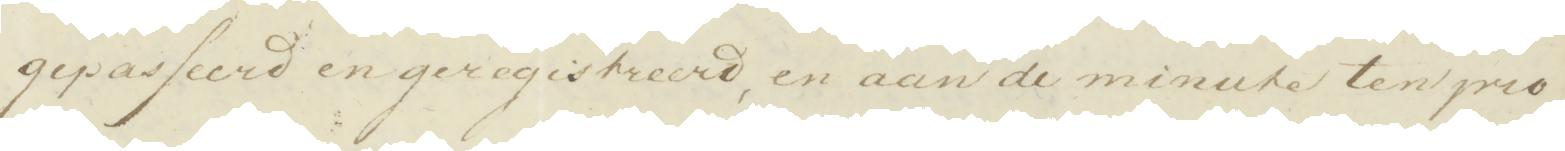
gepasseerd en geregistreerd, en aan de minute ten pro
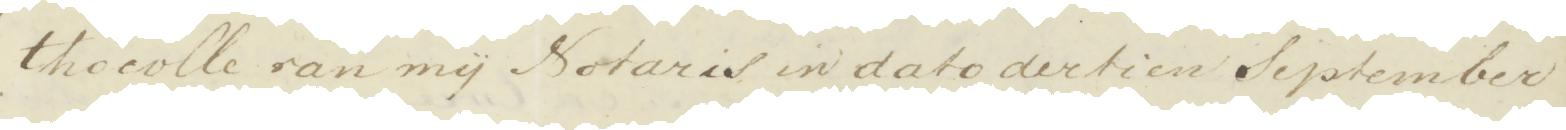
thocolle van mij Notaris in dato dertien September
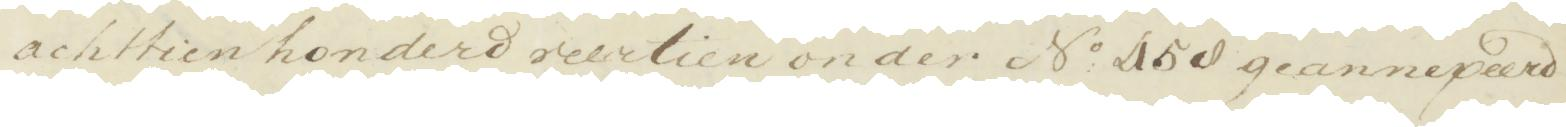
achttien honderd veertien onder N:o 458 geannexeerd
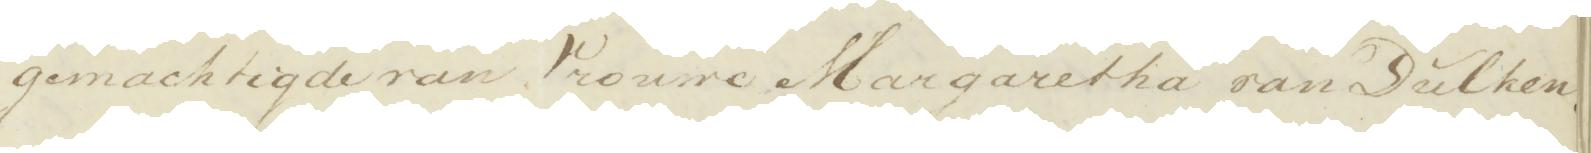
gemachtigde van Vrouwe Margaretha van Dulken
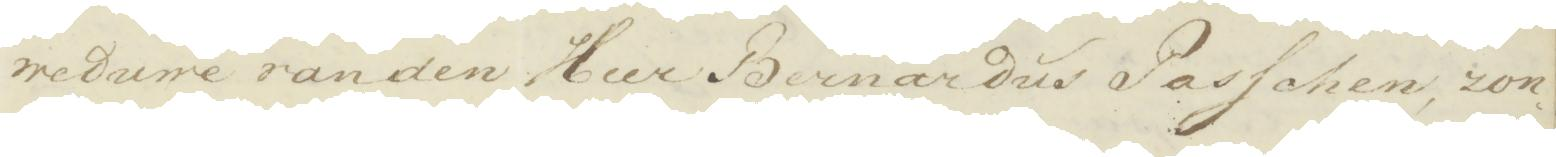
weduwe van den Heer Bernardus Passchen, zon„
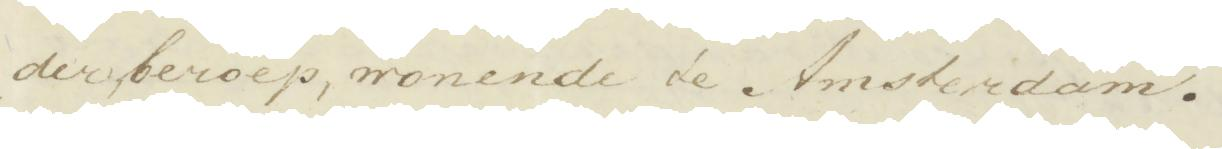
der beroep, wonende te Amsterdam.
